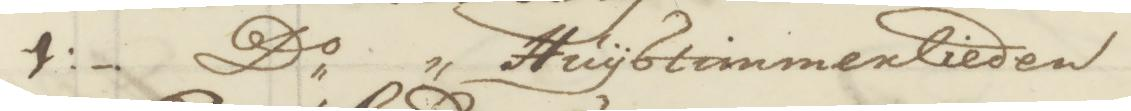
1:–. D„o „ Huijstimmerlieden
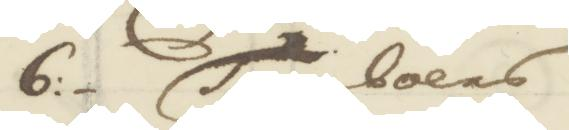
6:– Tamboers
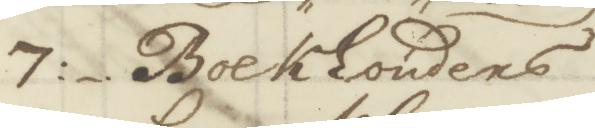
7:–. Boekhouders
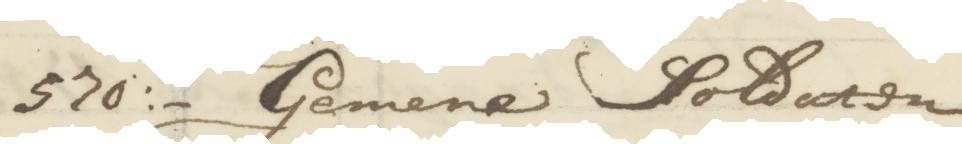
570:– Gemene soldaten
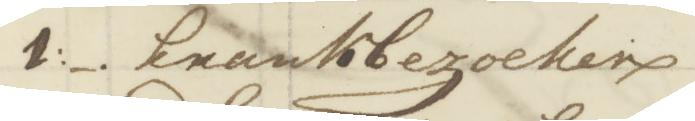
1:–. krankbezoeker
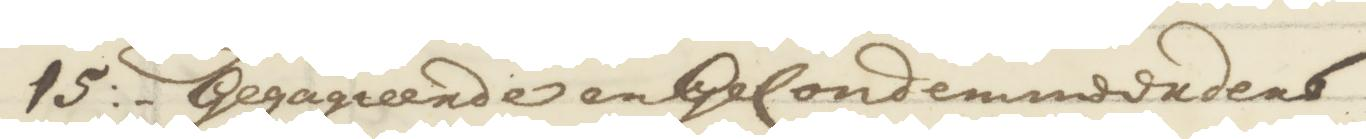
15: – Gegagieerde en gecondemneerders
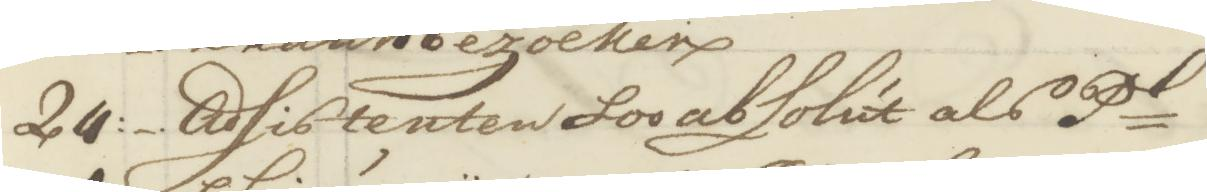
24:–. adsistenten soo absolut als p=l
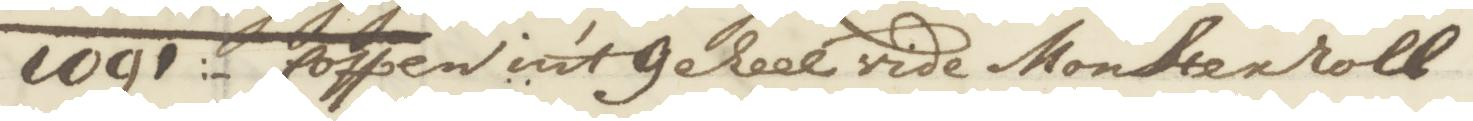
1091:– Coppen in’t geheel vide Monsterroll
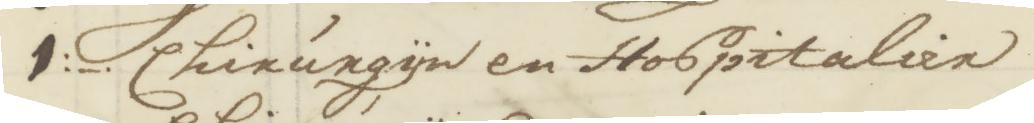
1:–. Chirurgijn en Hospitalier
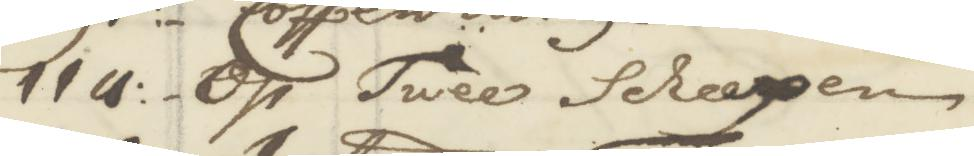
114:– Op Twee scheepen
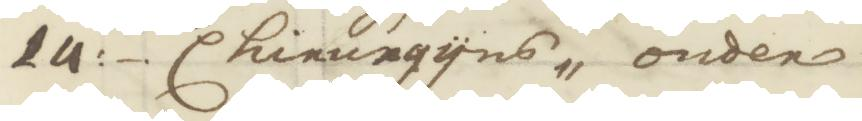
14: –. Chirurgijns „ onder
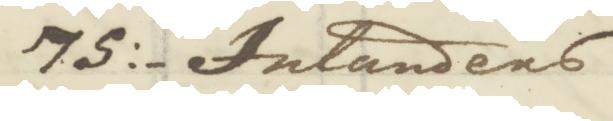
75:– Inlanders
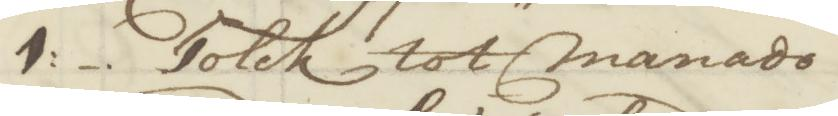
1: –. Tolck tot manado
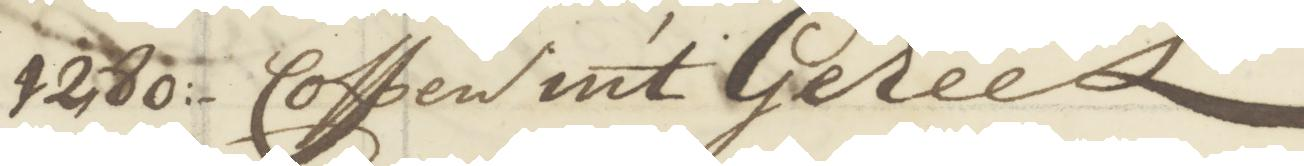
1280:- coppen in’t Geheel
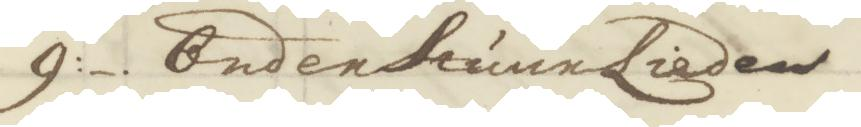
9:–. OnderstuurLieden
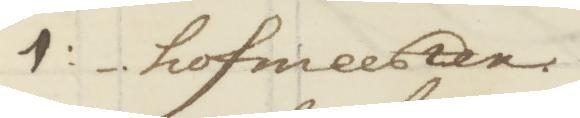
1: –. hofmeester.
